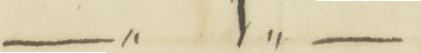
—„ 1„ —
